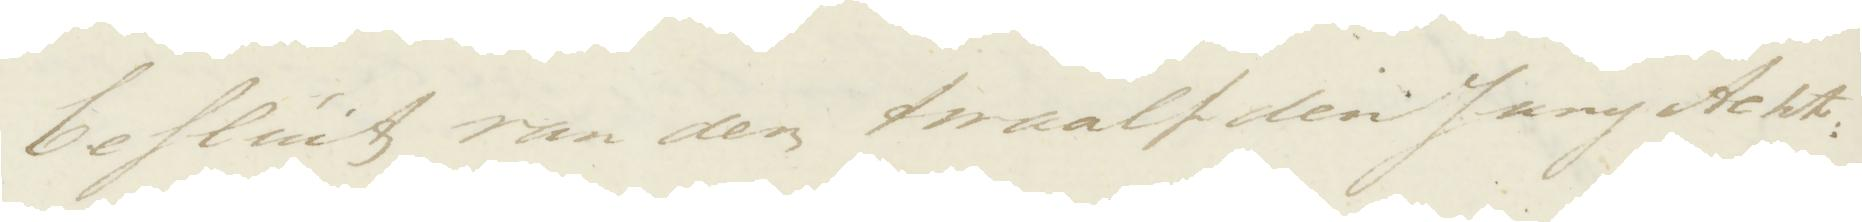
besluit van den twaalf den Junij Acht:
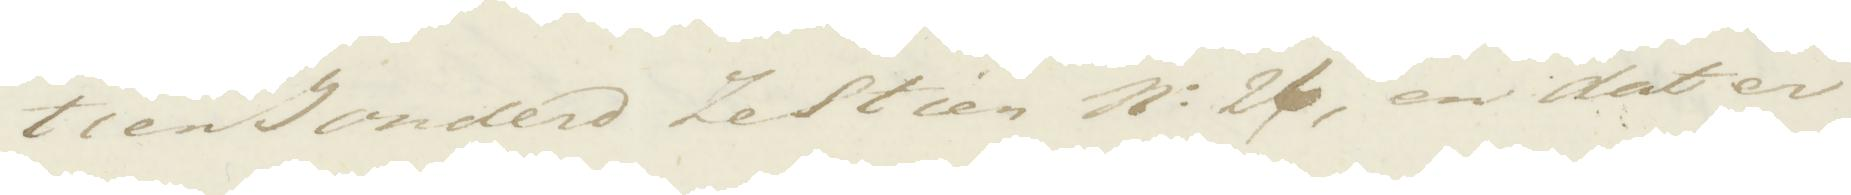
tien honderd Zestien N: 26, en dat er
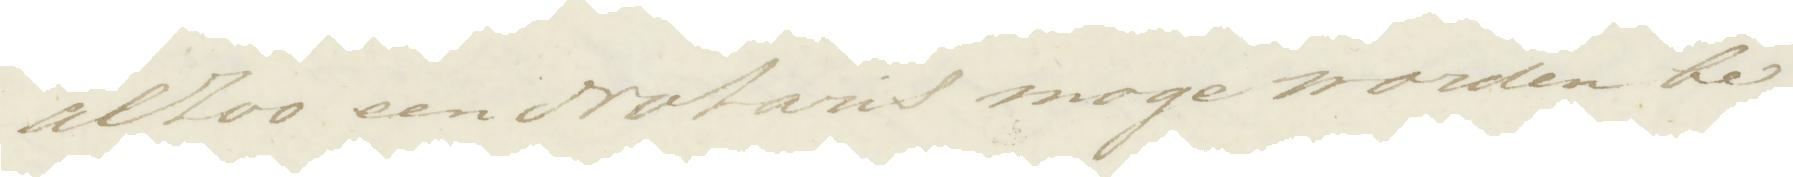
alzoo een Notaris moge worden be
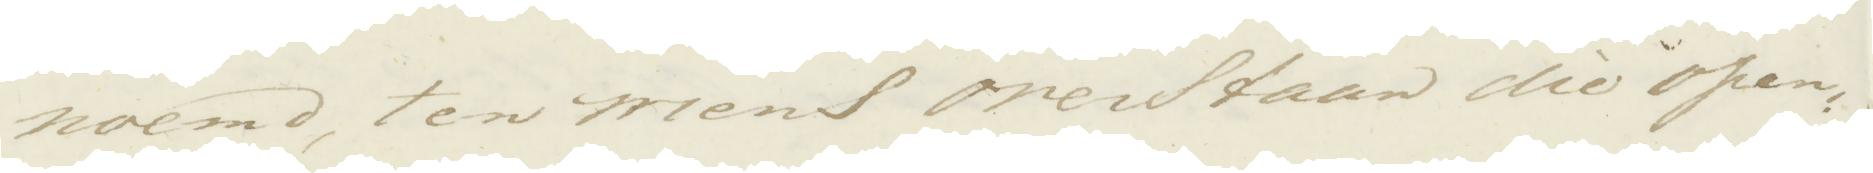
noemd, ten wiens overstaan die open,
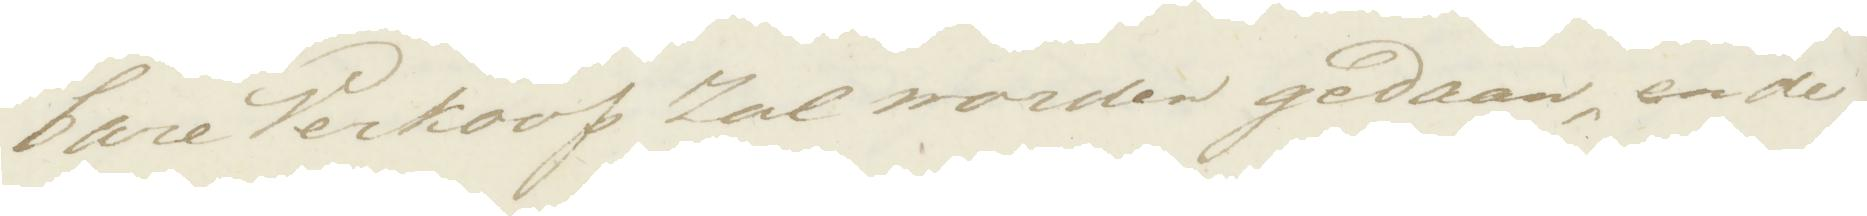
bare Verkoop zal worden gedaan, en de
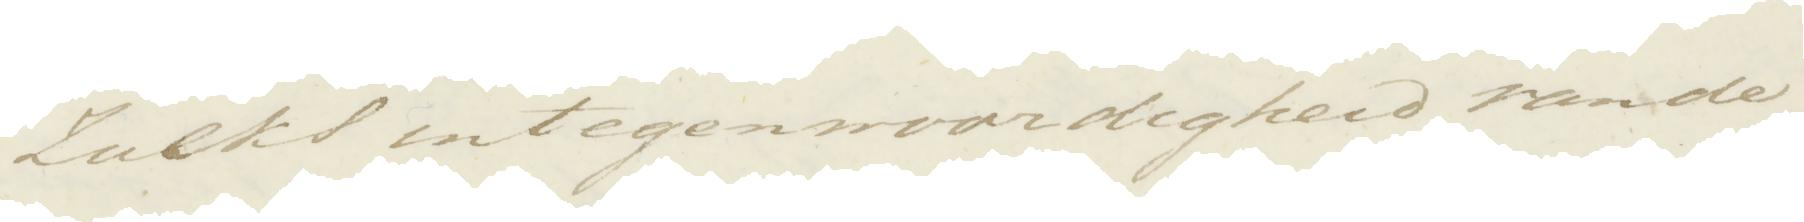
zulks in tegenwoordigheid van de
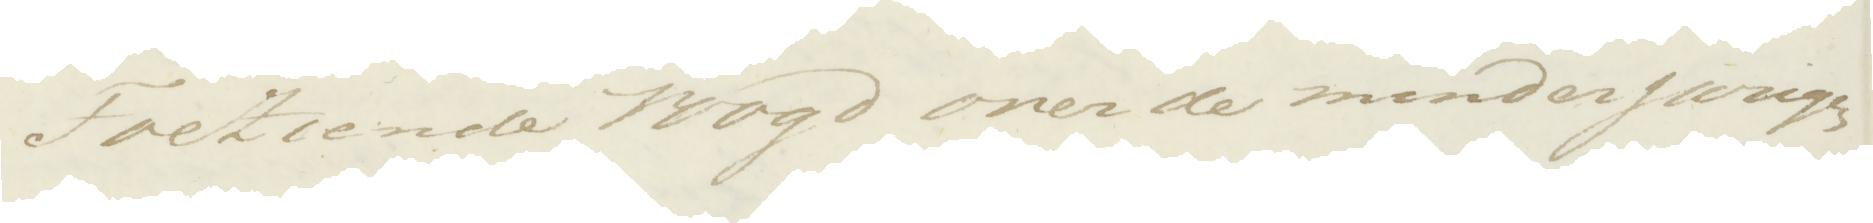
Toeziende Voogd over de minderjarigen
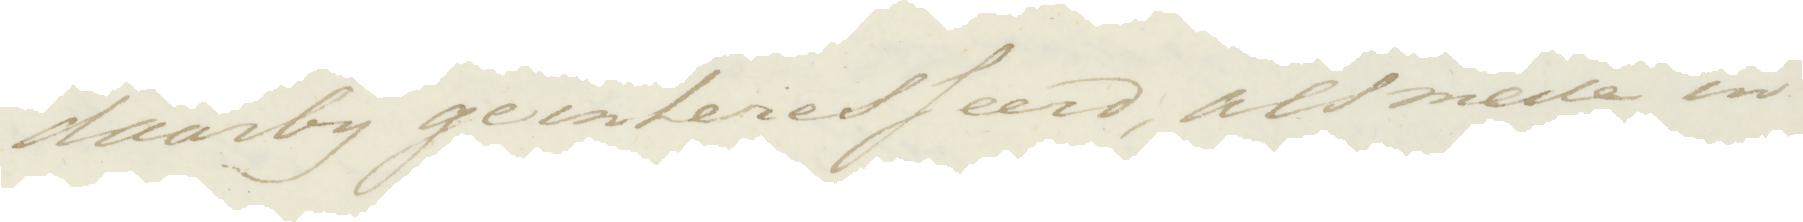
daarby geinteresseerd, als mede in
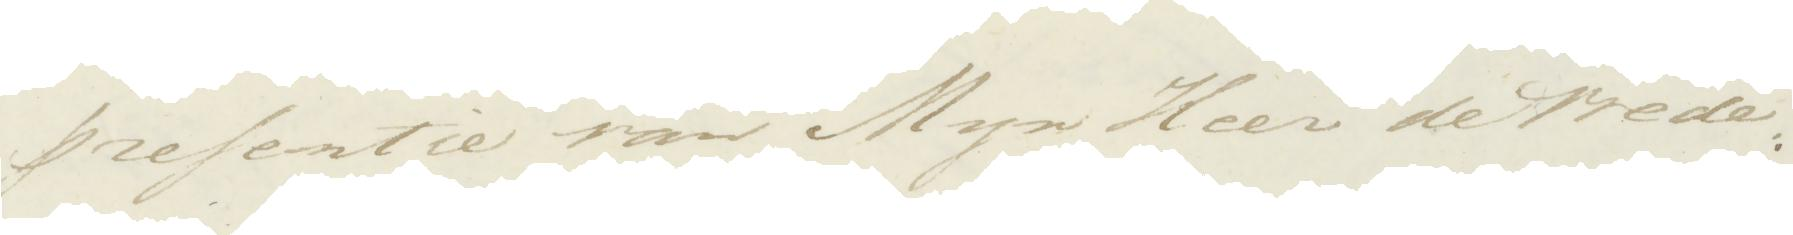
presentie van Myn Heer de Vrede„
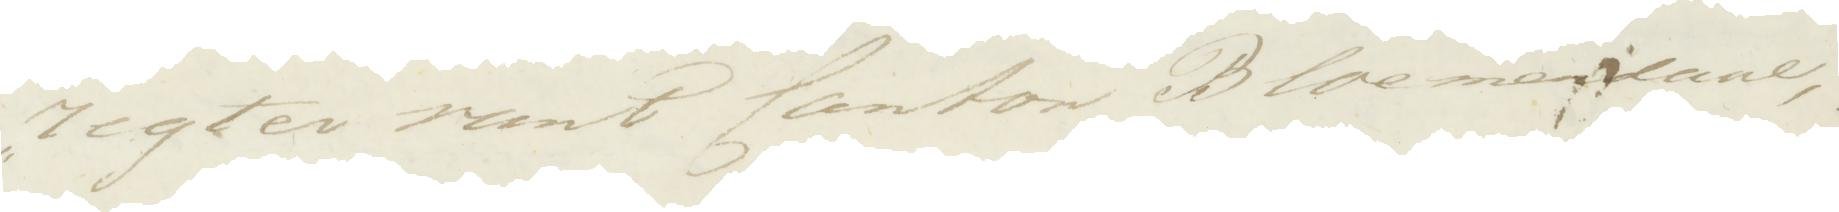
„regter van t Canton Bloemendaal,
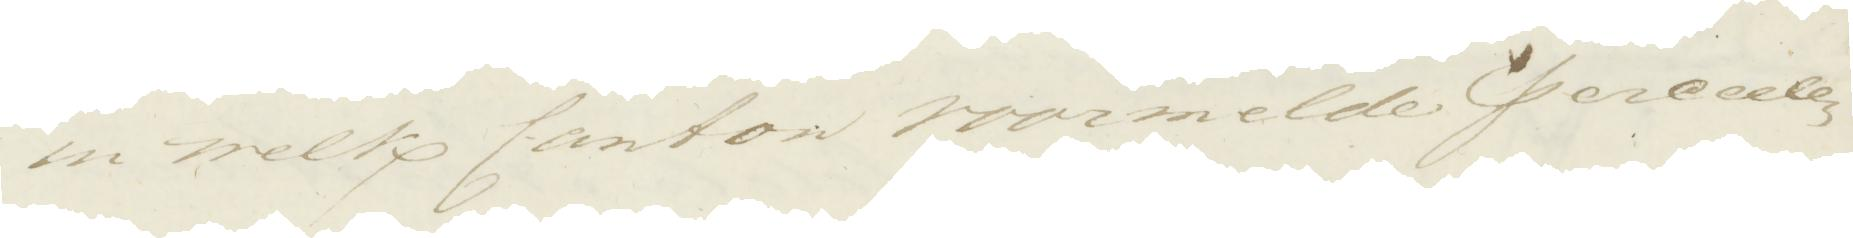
in welk Canton voormelde Perceelen
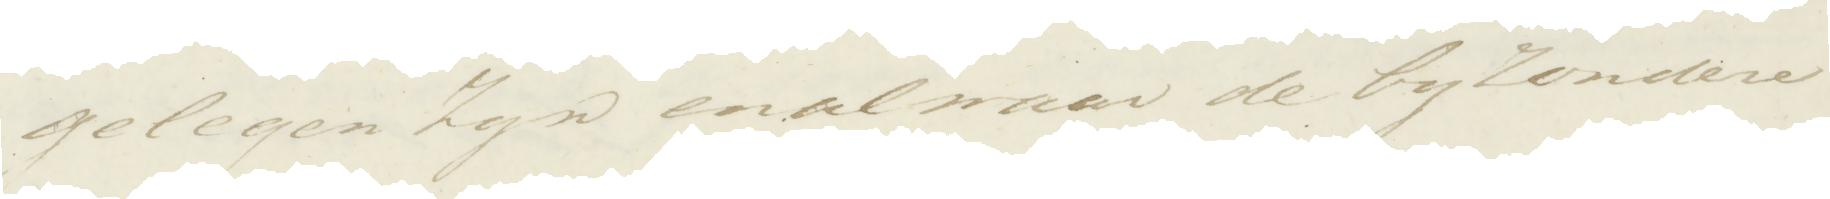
gelegen Zyn en alwaar de byzondere
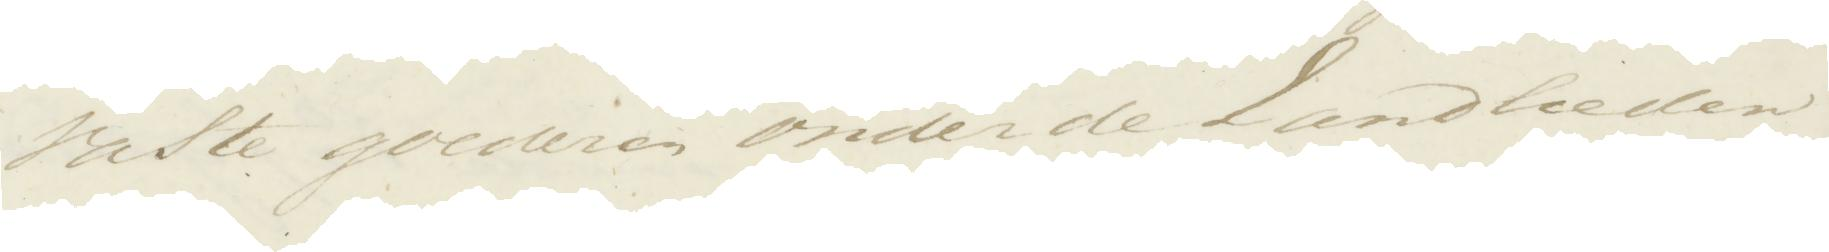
vaste goederen onder de Landlieden
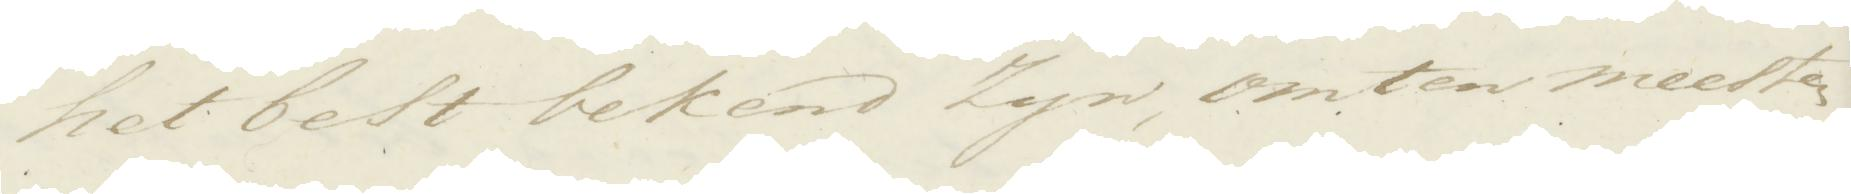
het best bekend Zyn, om ten meesten
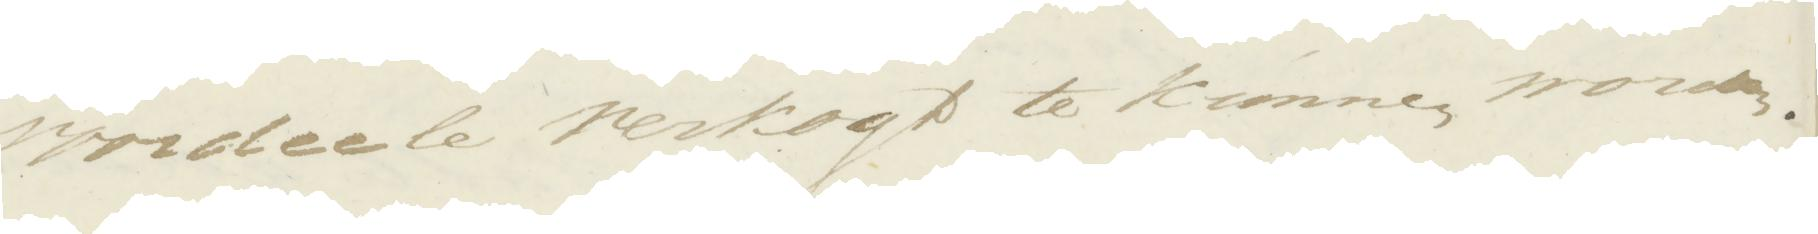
voordeele verkogt te kunnen worden.
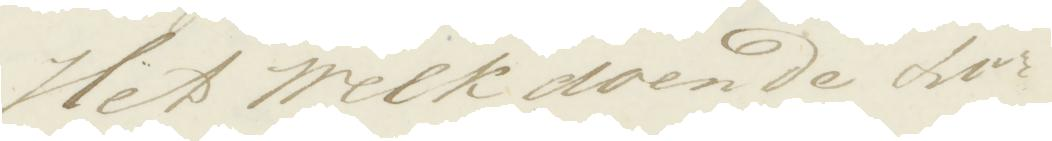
Het welk doende Et:ca
